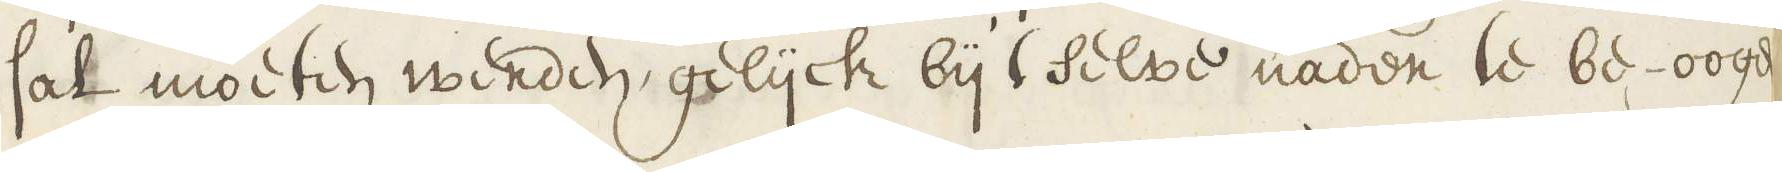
sal moeten werden, gelijck bij 't selve nader te be-ooge
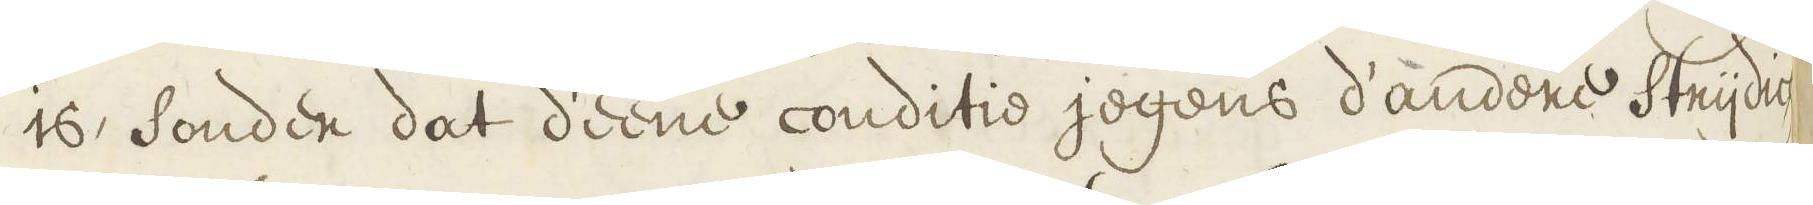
is, sonder dat d'eene conditie jegens d’andere strijdig
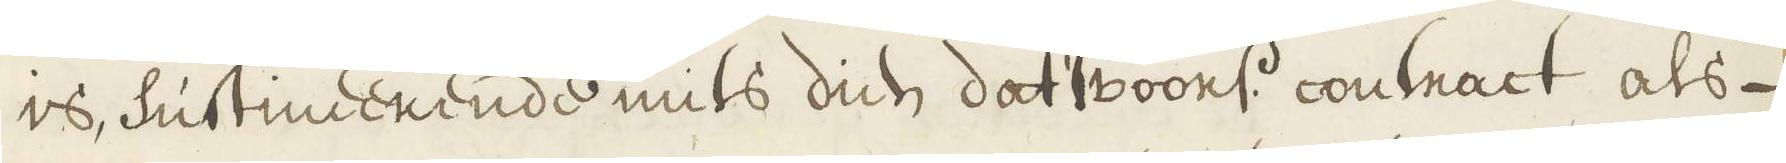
is, sustineerende mits dien dat 'svoors. contract als —
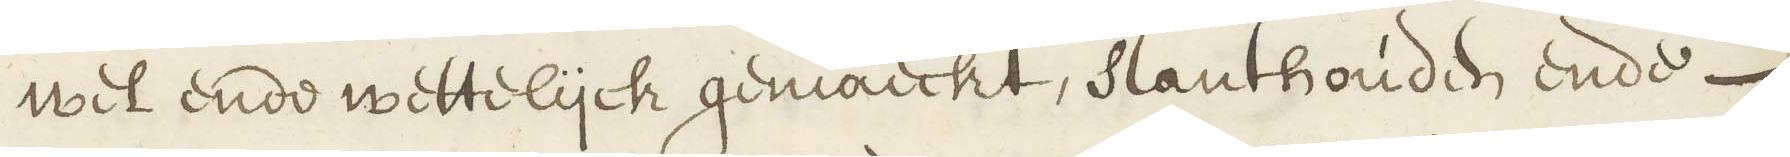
wel ende wettelijck gemaeckt, stanthouden ende —
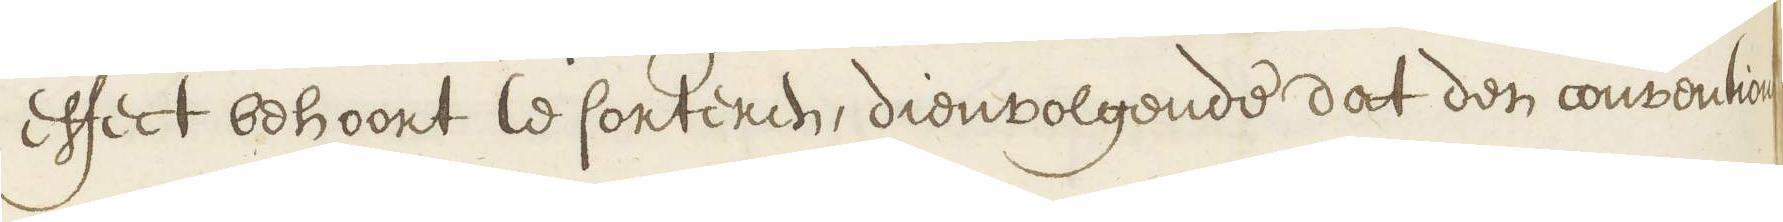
effect behoort te sorteren, dienvolgende dat den conventio
